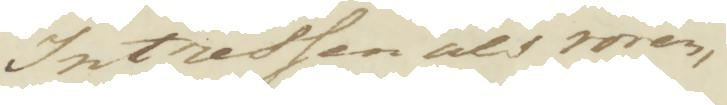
Intressen als voren,
